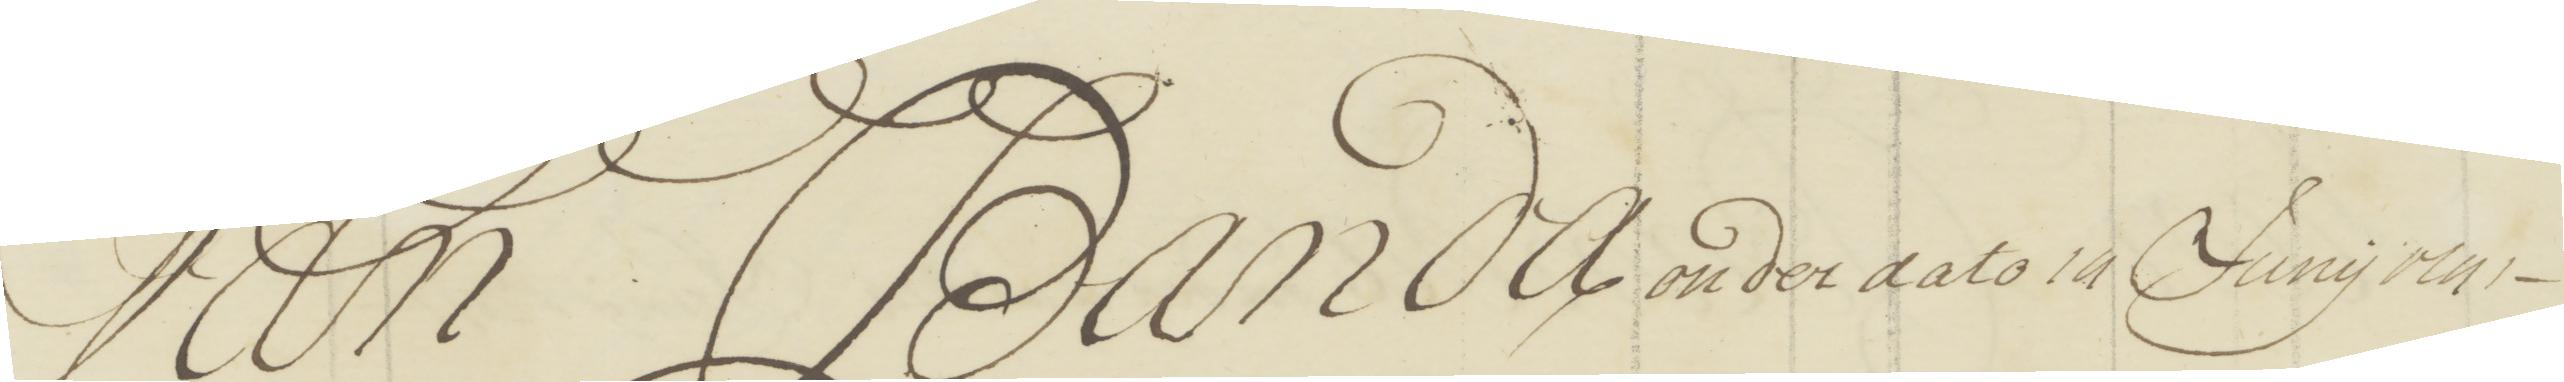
Van Banda on der dato 14 Junij 1741—
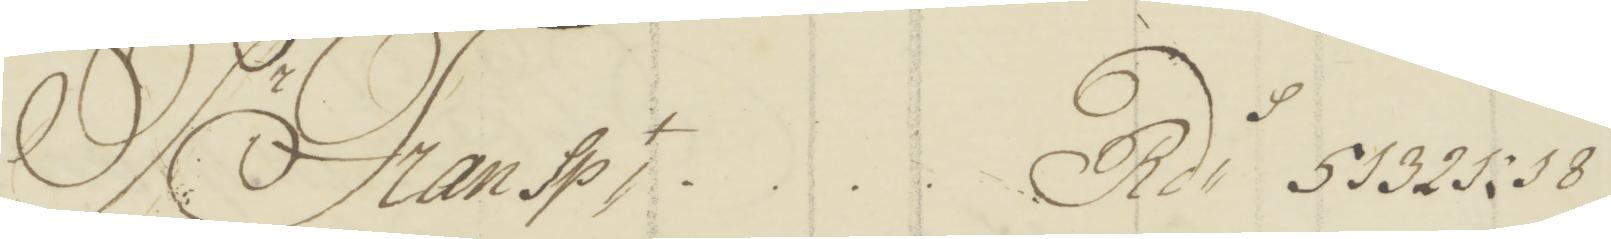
P„r Transp„t . . . . Rd„s 51321:18
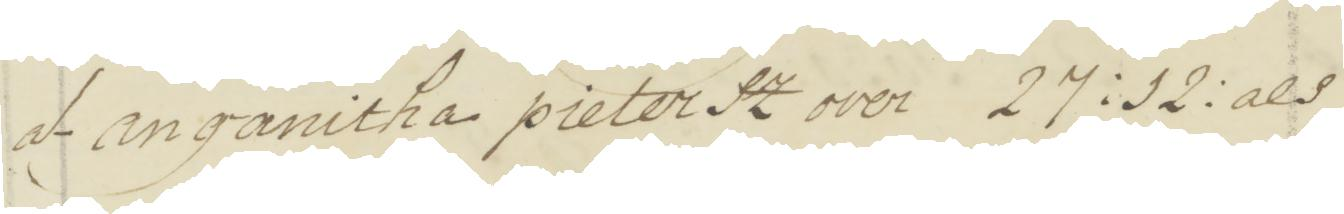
a- an ganitha pietersz over 27:12:als
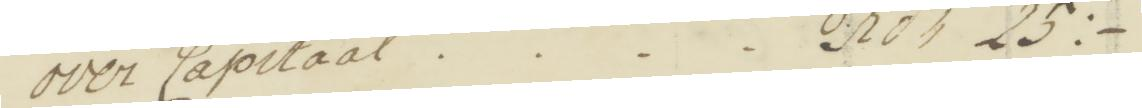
over Capitaal - - - - Rd„s 25:-
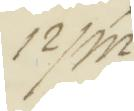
12/m
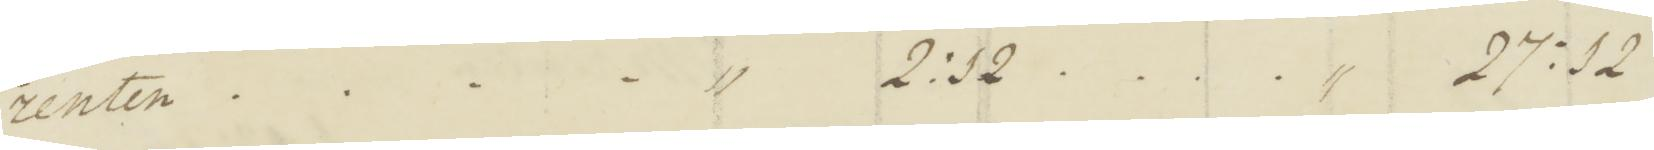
renten - - - - „ 2:12 . . . . „ 27:12
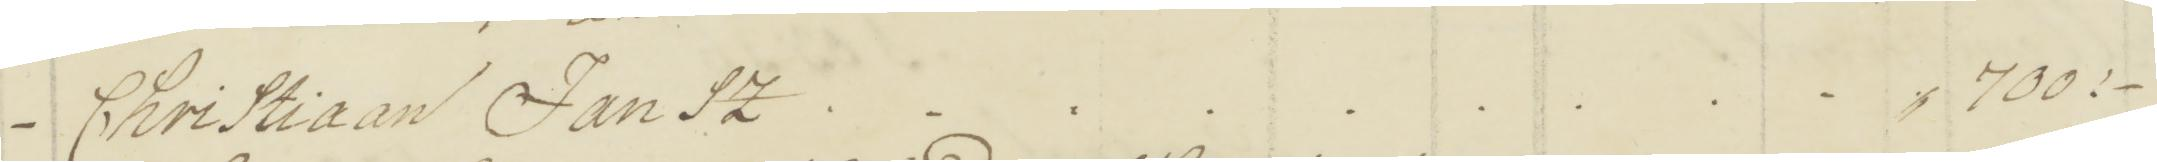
- Christiaan Jansz - - - - - - - - - „ 700 :-
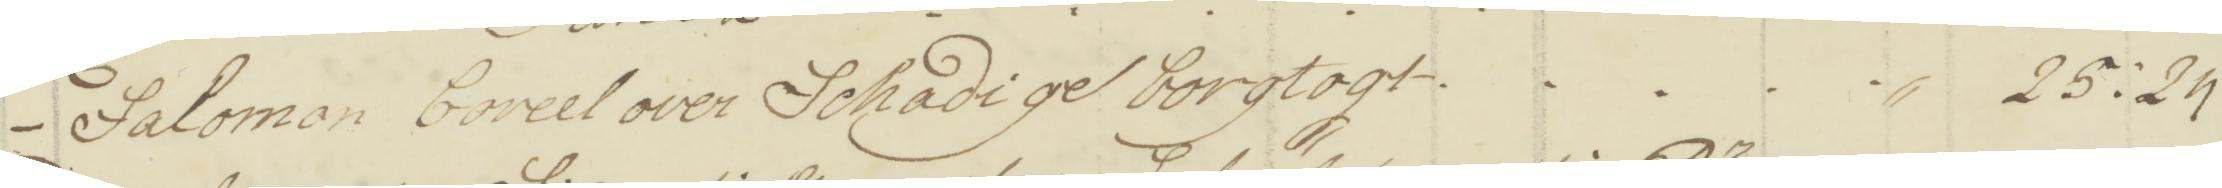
- Salomon boveel over schadige borgtogt - - - - „ 25:24
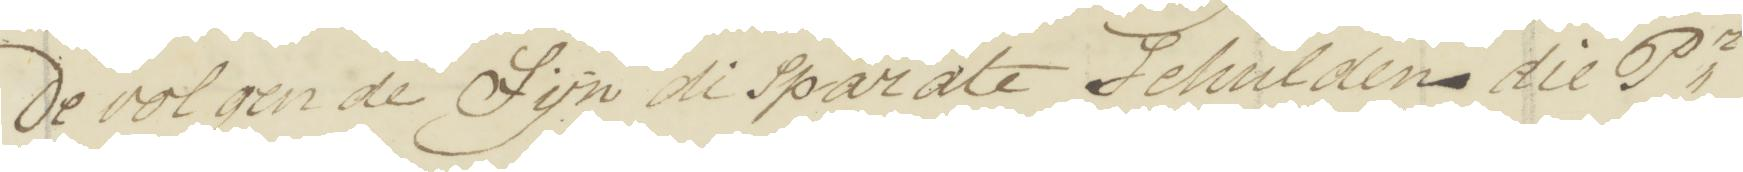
de volgende sijn disparate schulden die P„r
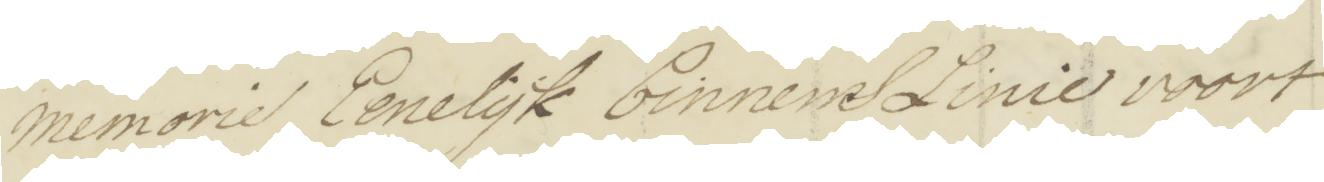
memorie Eenelijk binnens Linie voort
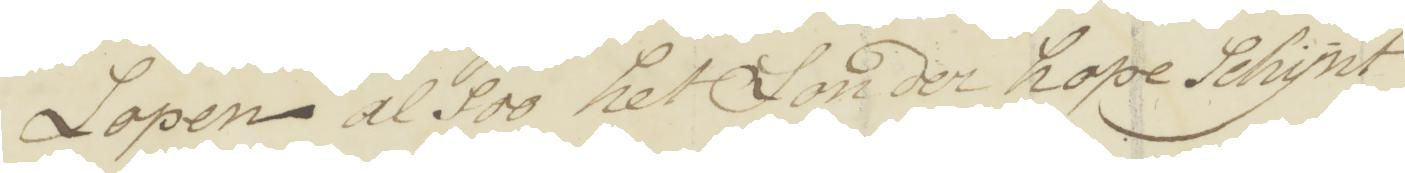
Lopen al soo het sonder hope schijnt
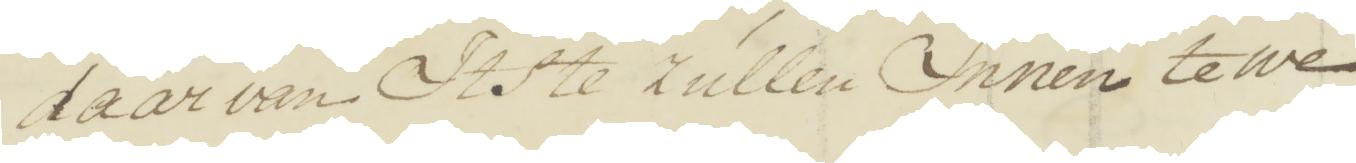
daar van Itste zullen Innen te we
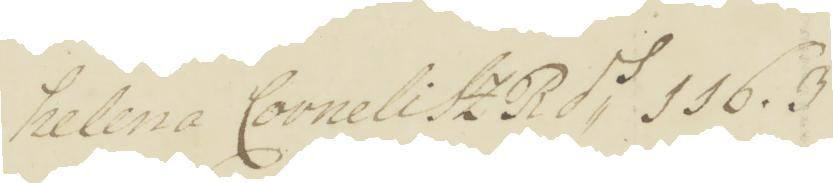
helena Cornelisz Rd„s 116.3
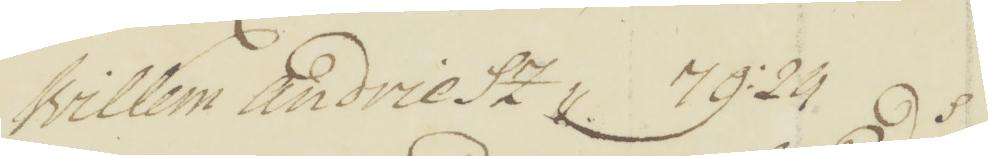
Willem andriesz „ 79:24
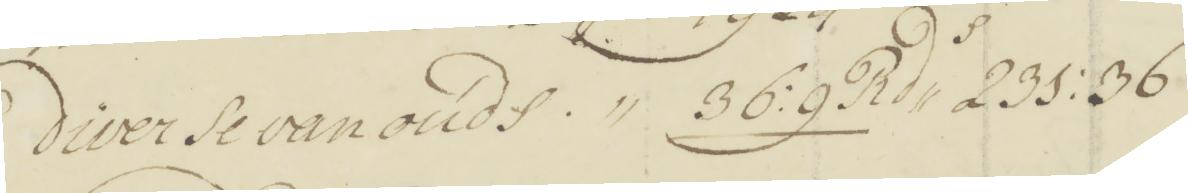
diverse van ouds . „ 36:9 Rd„s 231:36
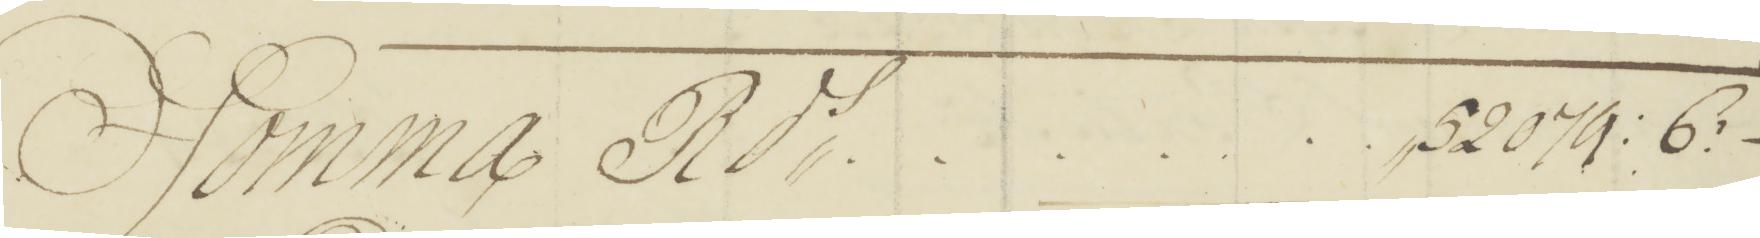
Somma Rd„s - - - - „52074: 6:
